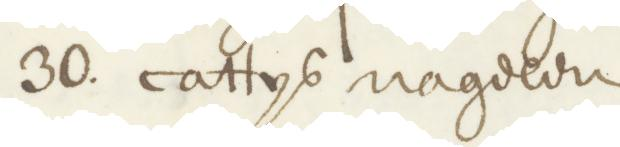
30. cattys nagelen
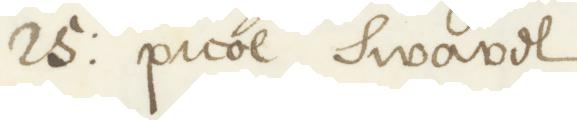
25: picol swavel
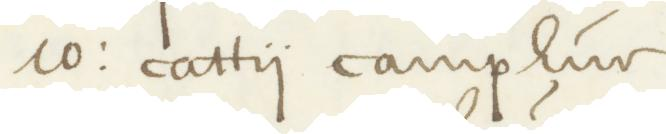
10: cattij camphur
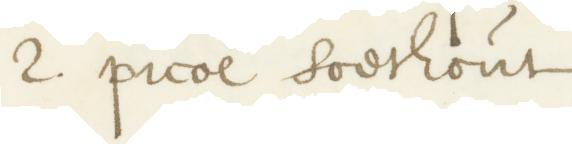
2. picol soethout
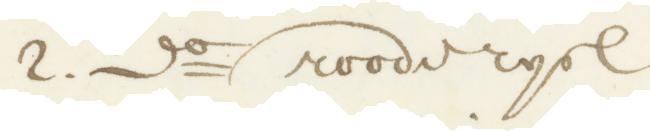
2. d=o roode ryst
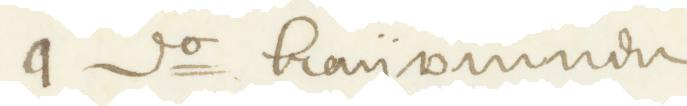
4 d=o kaijvinnen
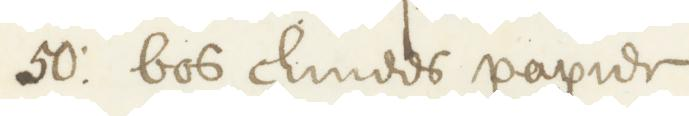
50: bos chinees papier
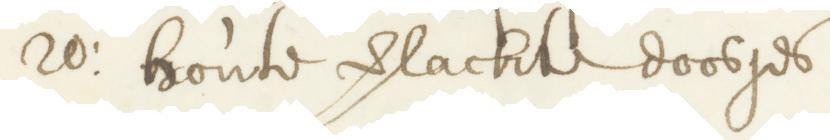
20: houte verlackte doosjes
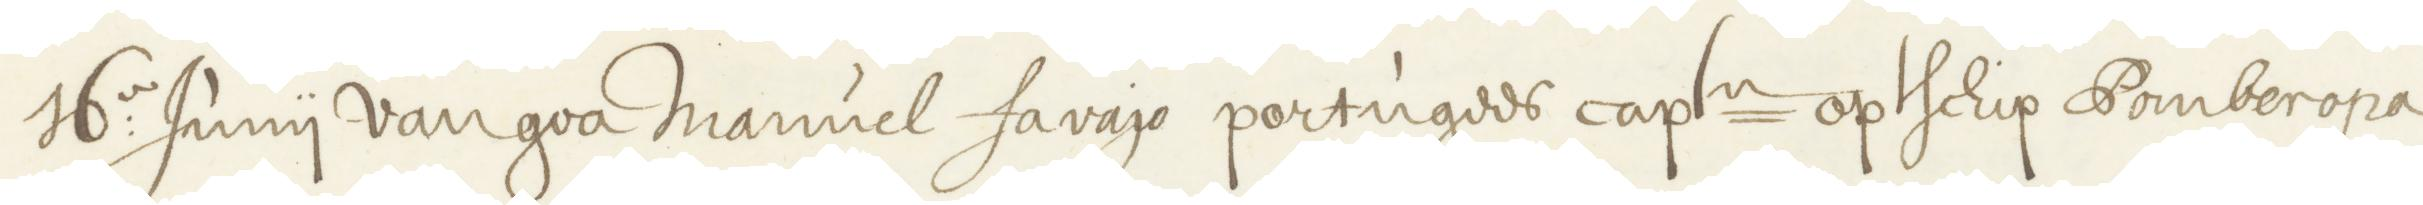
16:e Junij van goa manuel favajo portugees capt=n op t schip Pomberopa
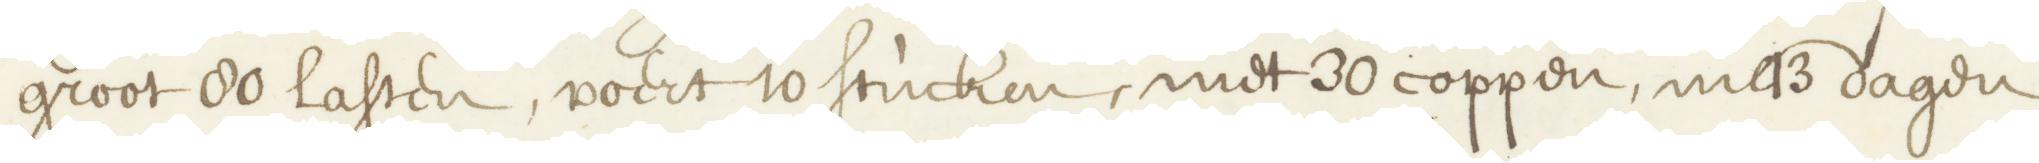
groot 80 lasten, voert 10 stucken, met 30 coppen, in 43 dagen
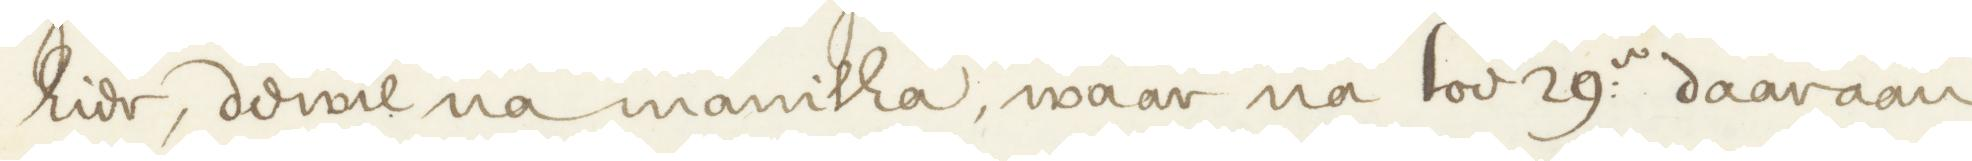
hier, dewil na manilha, waar na toe 29:e daaraan
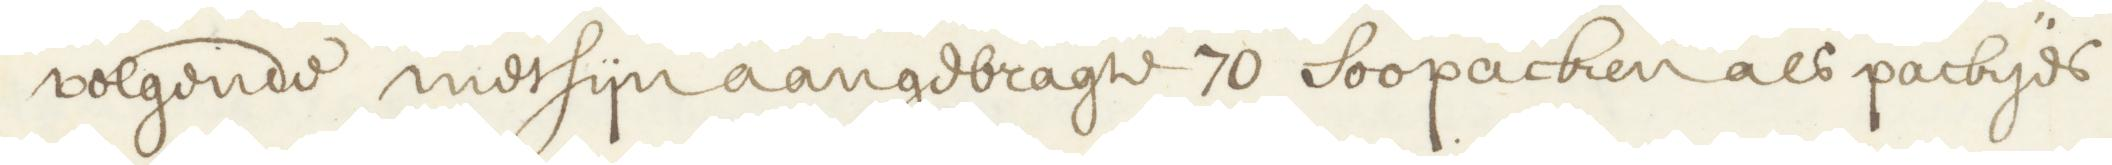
volgende met sijn aangebragte 70 soopacken als packjes
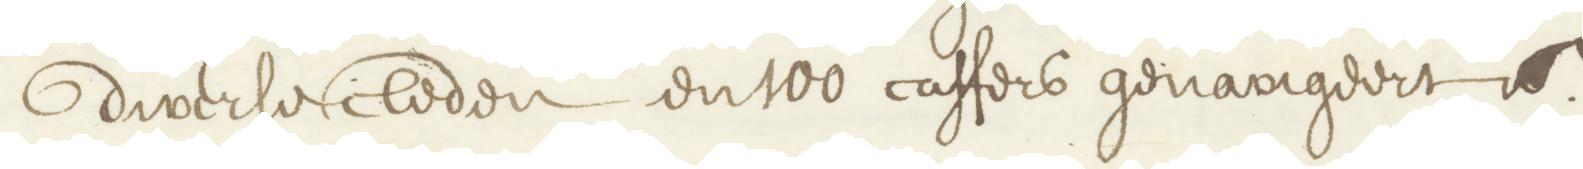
dwersekleden en 100 caffers genavigeert is.
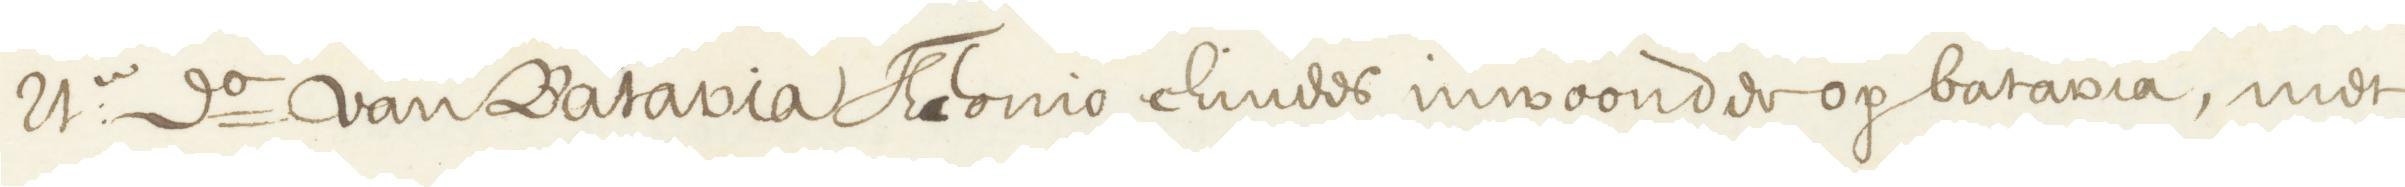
21:e d=o van Batavia Theonio chinees inwoonder op batavia, met
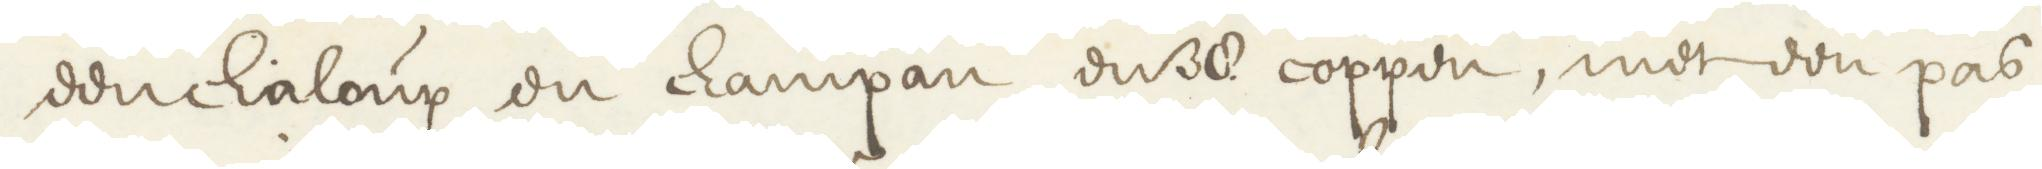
een chaloup en champan en 38. coppen, met een pas
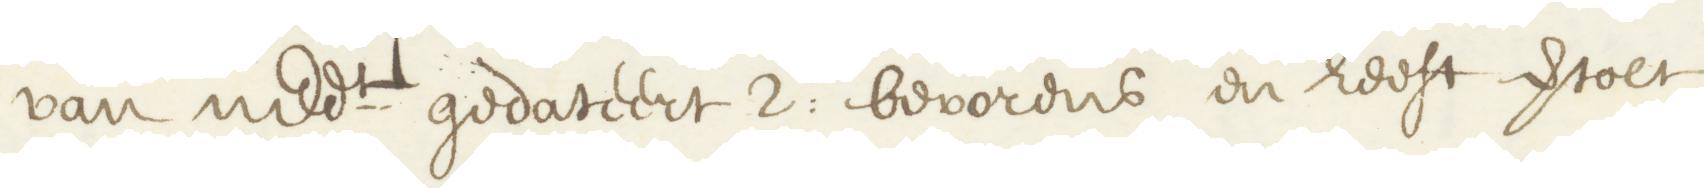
van uEd=t gedateert 2:e bevorens en heeft vertolt
